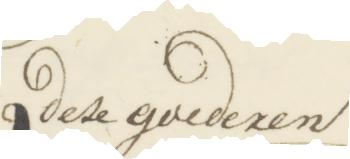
dese goederen
